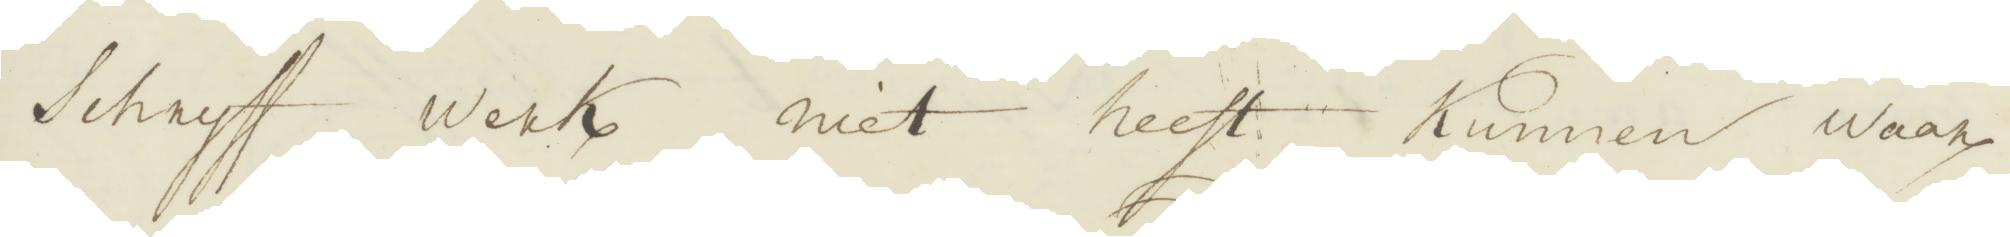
schryff werk niet heeft kunnen waar
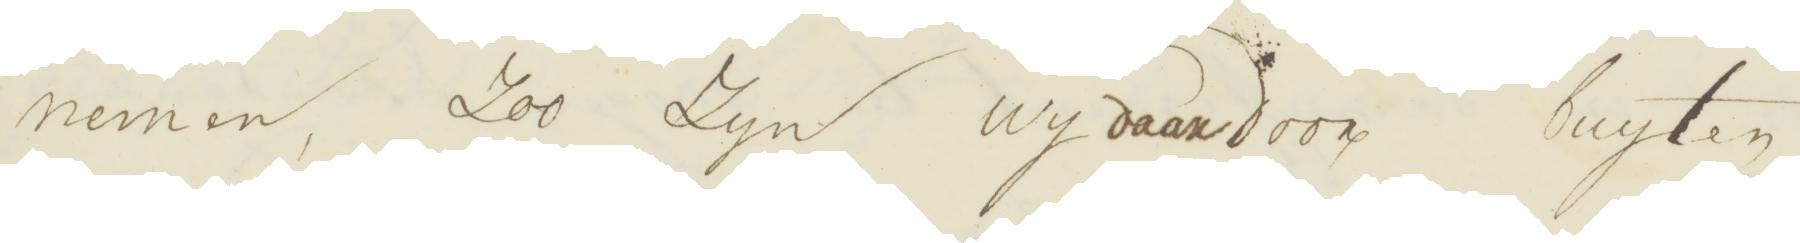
nemen zoo zyn wy daardoor buyten
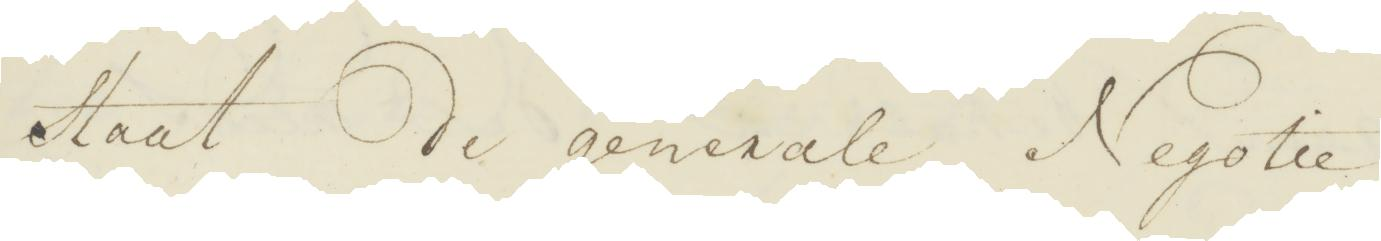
staat de generale Negotie boeken
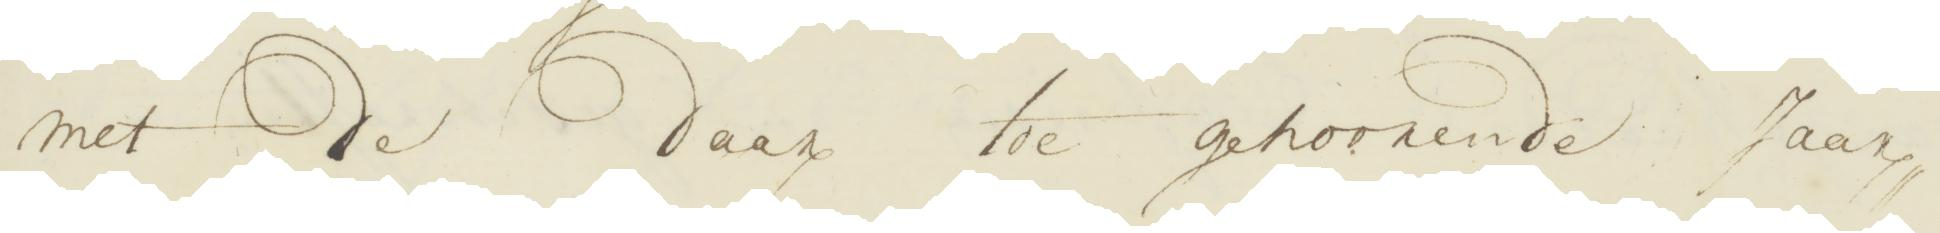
met de daar toe gehoorende jaar„
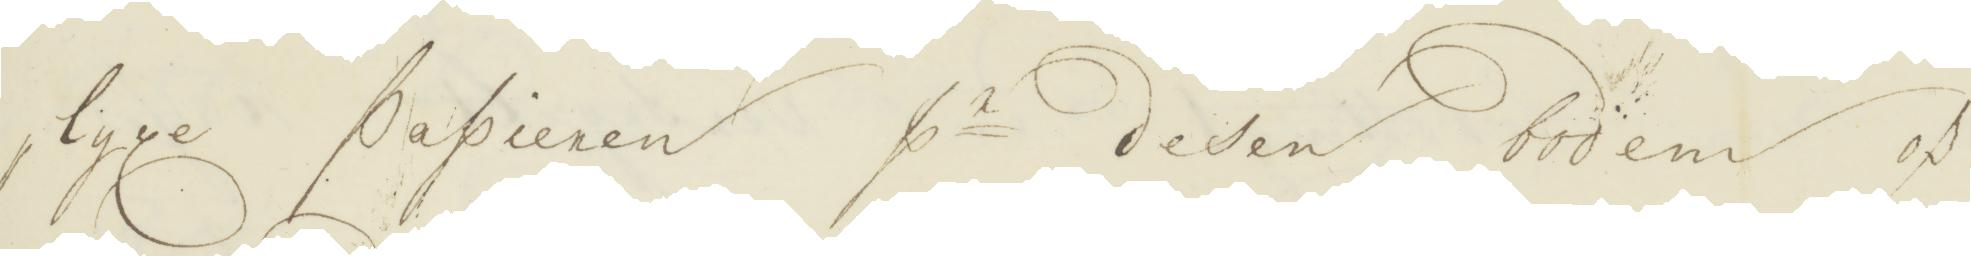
lyxe papieren p=r desen bodem op
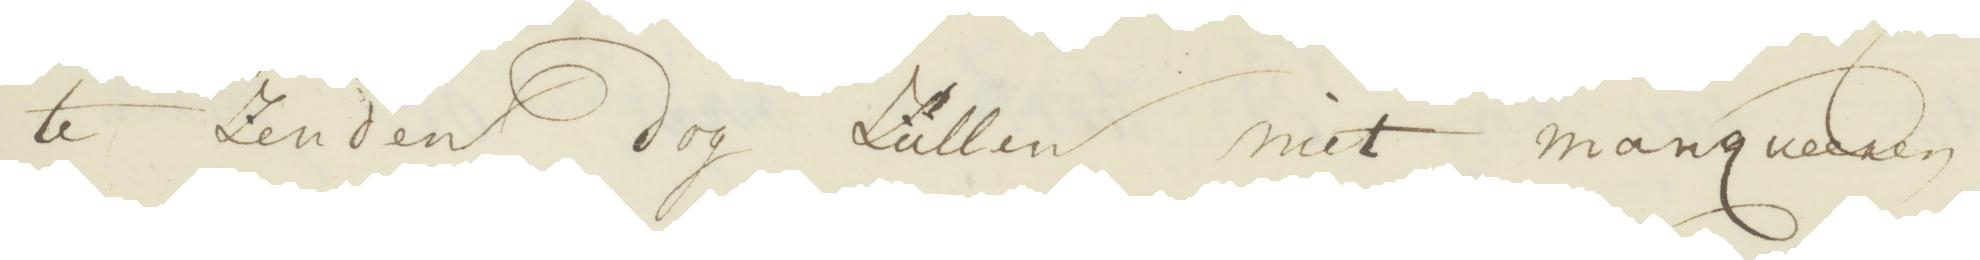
te zenden dog zullen niet manqueeren
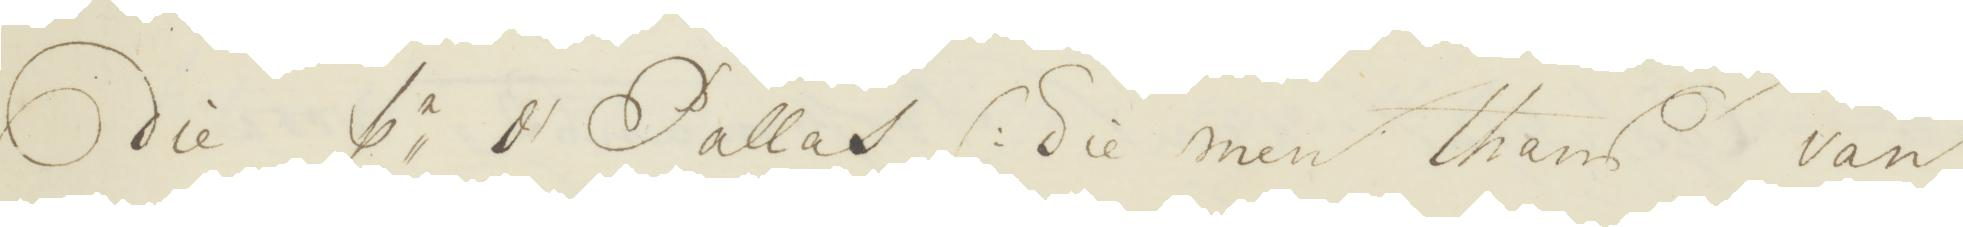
die p„r d' Pallas (: die men thans van
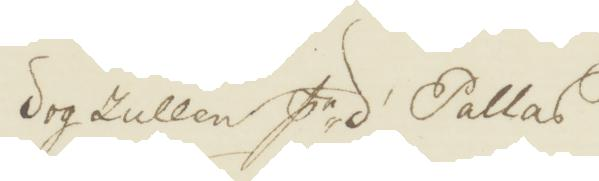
dog zullen p„r d' Pallas
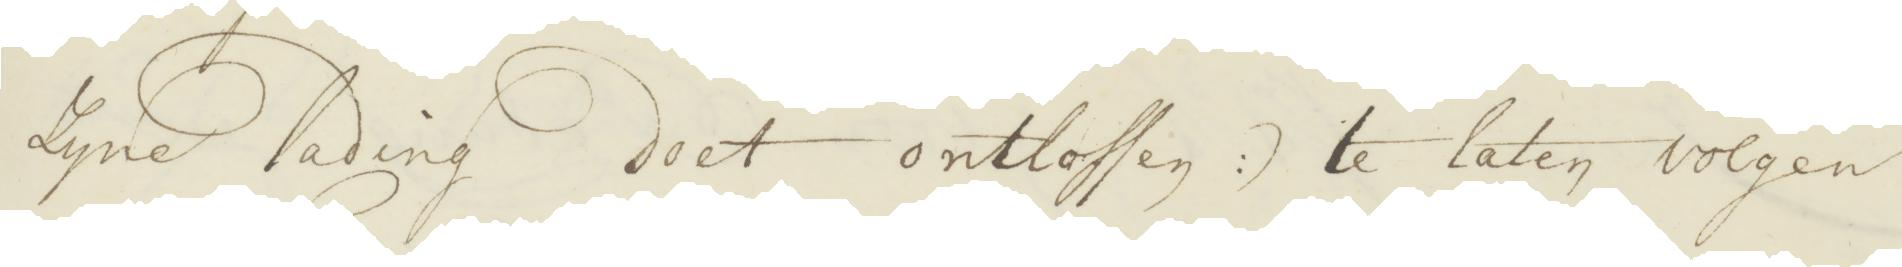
zyne lading doet ontlossen :) te laten volgen
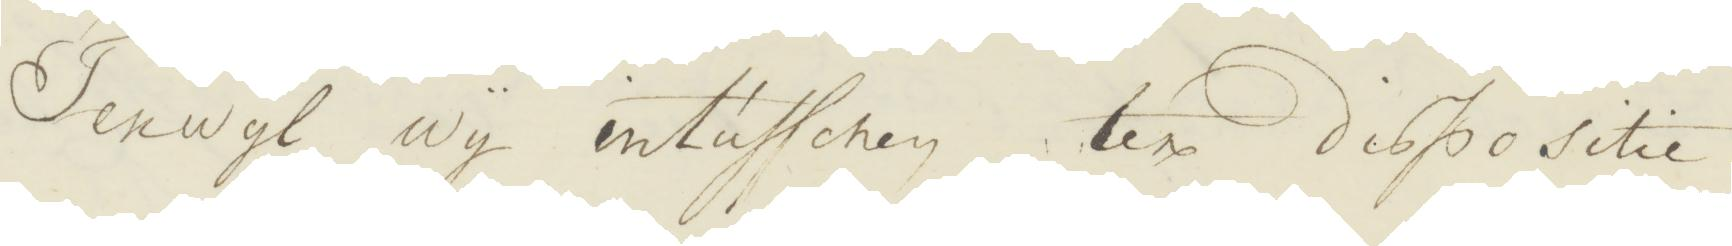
Terwijl wij intusschen ter dispositie
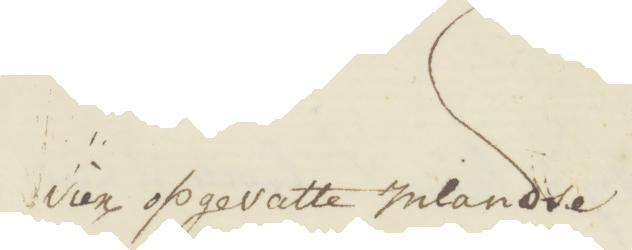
vier opgevatte Jnlandse
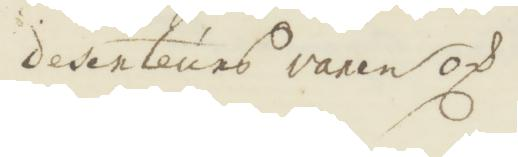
deserteurs varen over
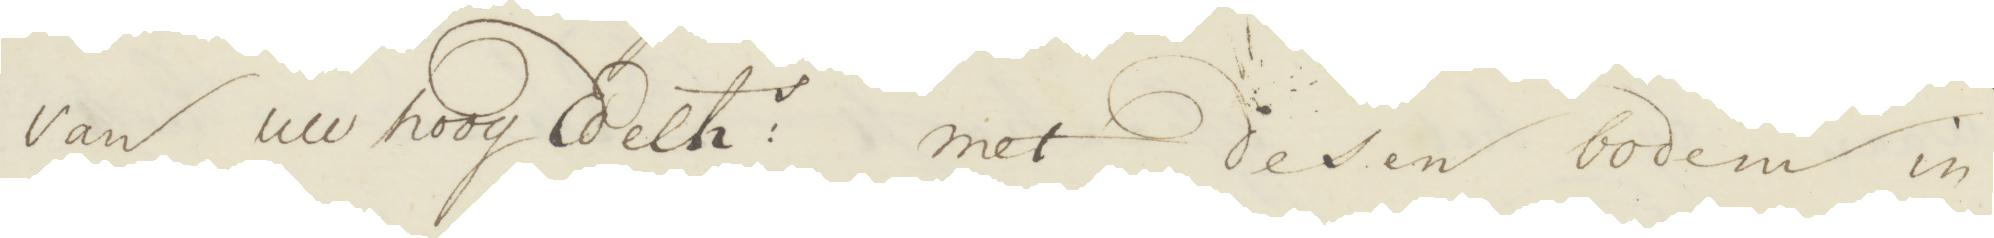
van uw hoog Edelh:s met desen bodem in
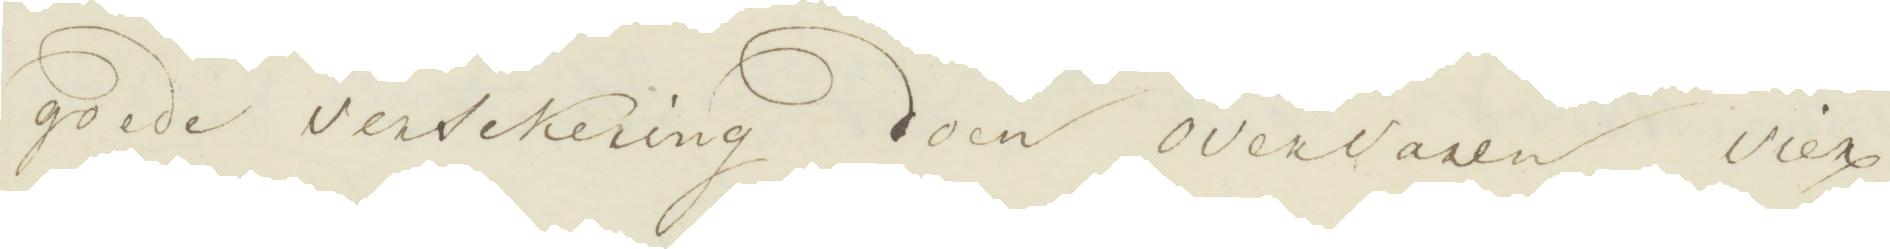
goede versekering doen overvaren vier
